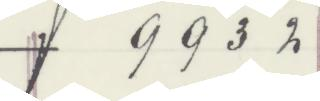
ƒ 9932
